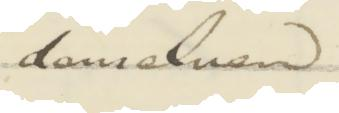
dencelven
